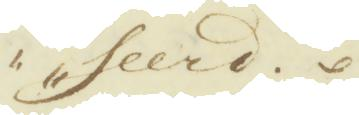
„ „seerd.—
